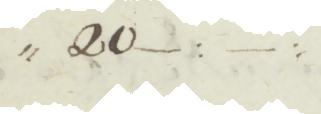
„ 20 —: —:
